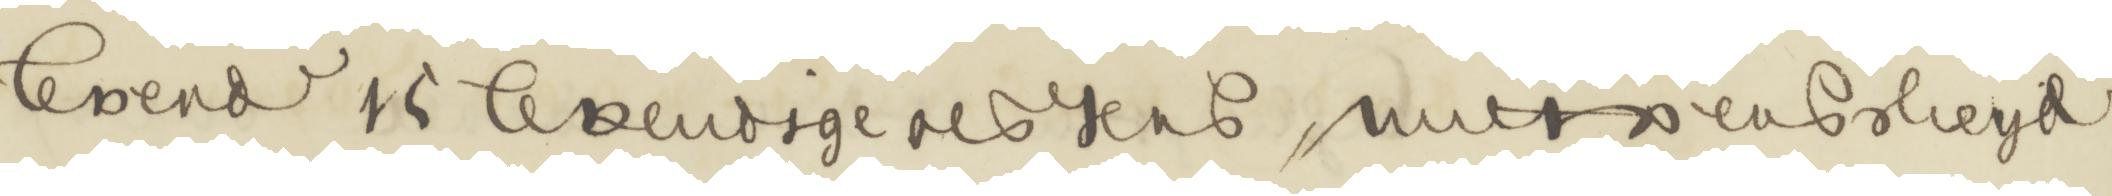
leverde 15 levendige oesters, met verscheijde
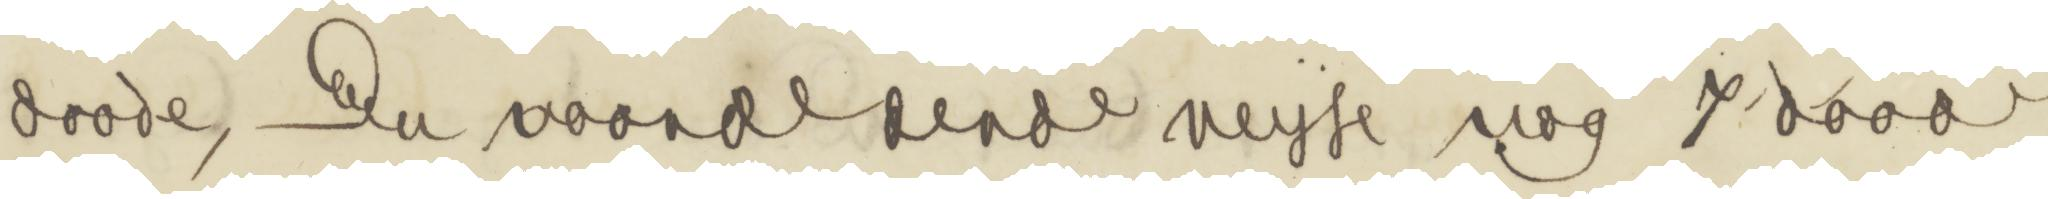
doode, En voorde derde reijse nog 7 doode
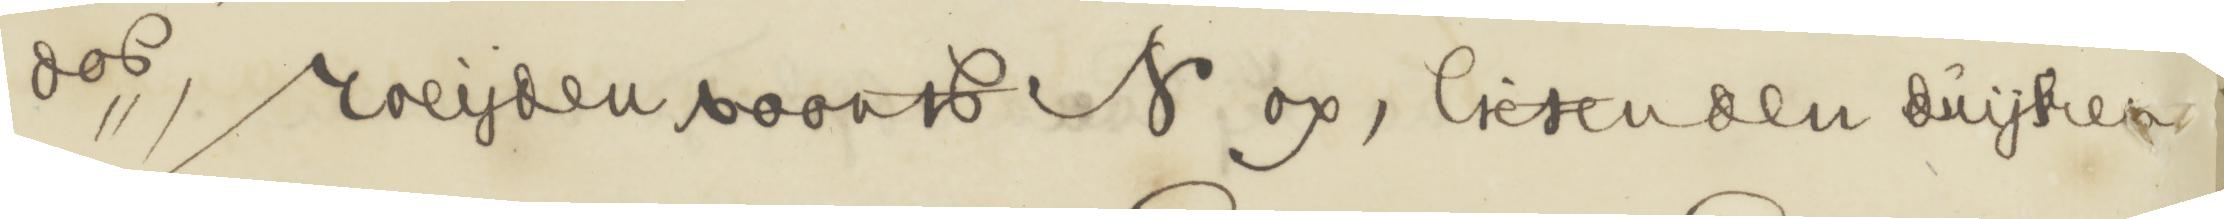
do„s, roeijden voorts N op, lieten den duijker
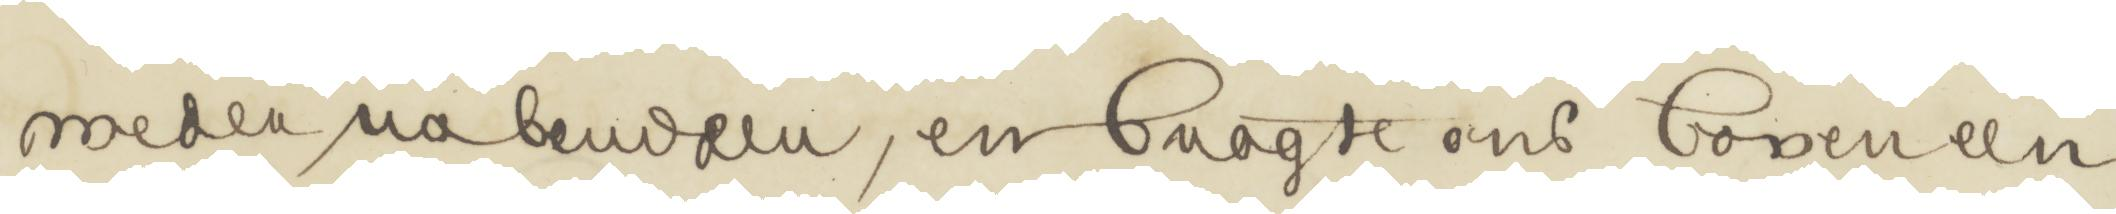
weder na beneden, en bragte ons boven een
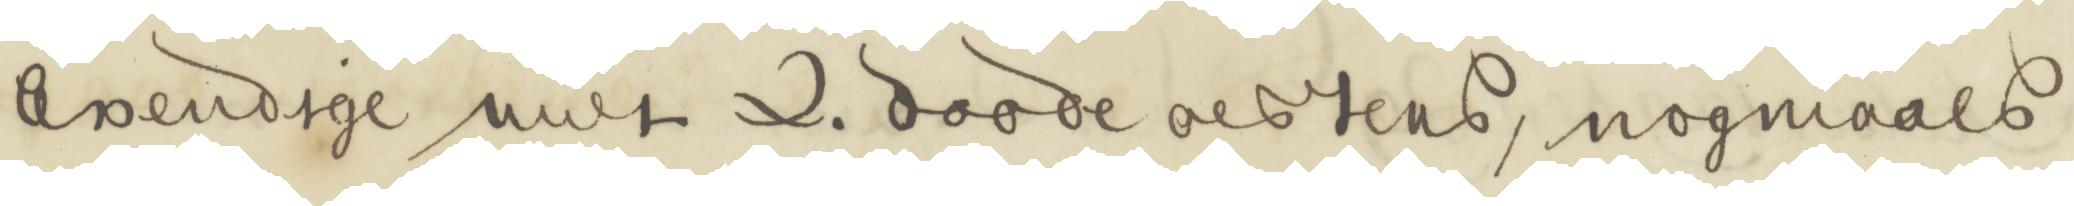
levendige met 2. doode oesters, nogmaals
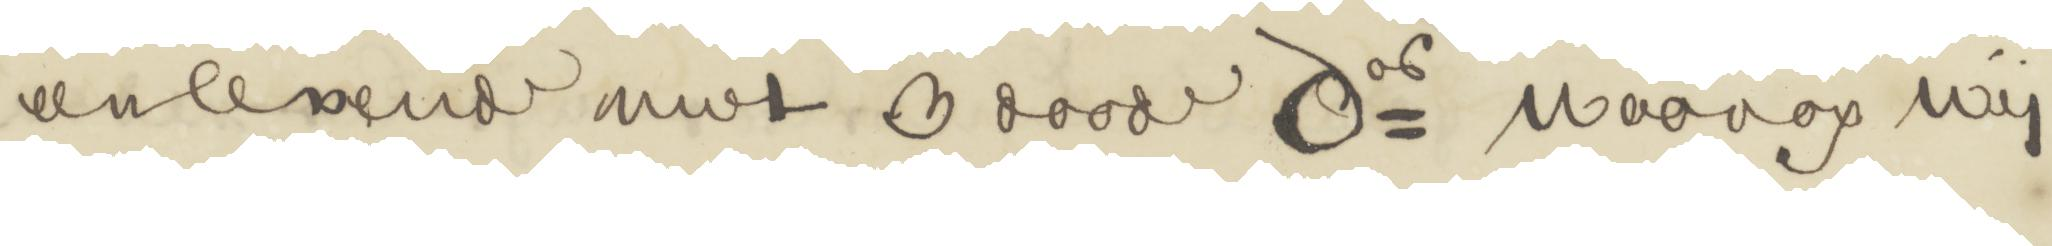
een levende met 3 doode d=os waarop wij
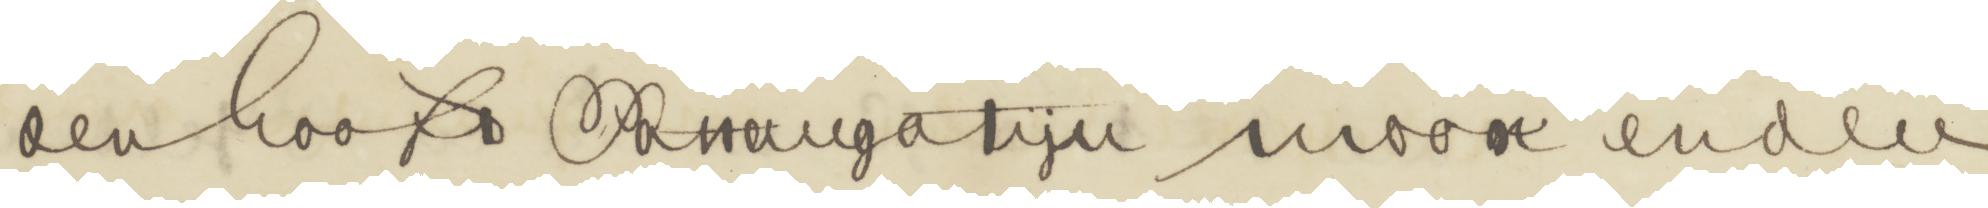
den hooft Pattangatijn moor en den
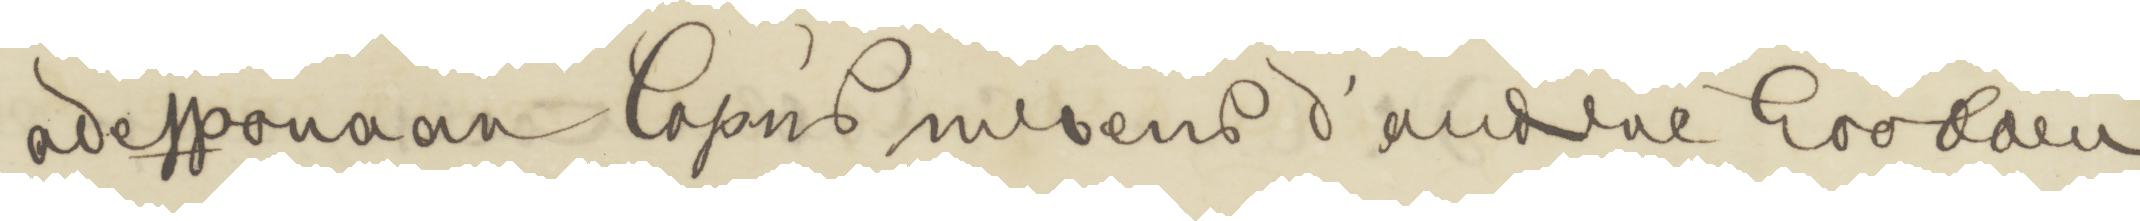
adepponaar Copus nevens d’ andere hoofden
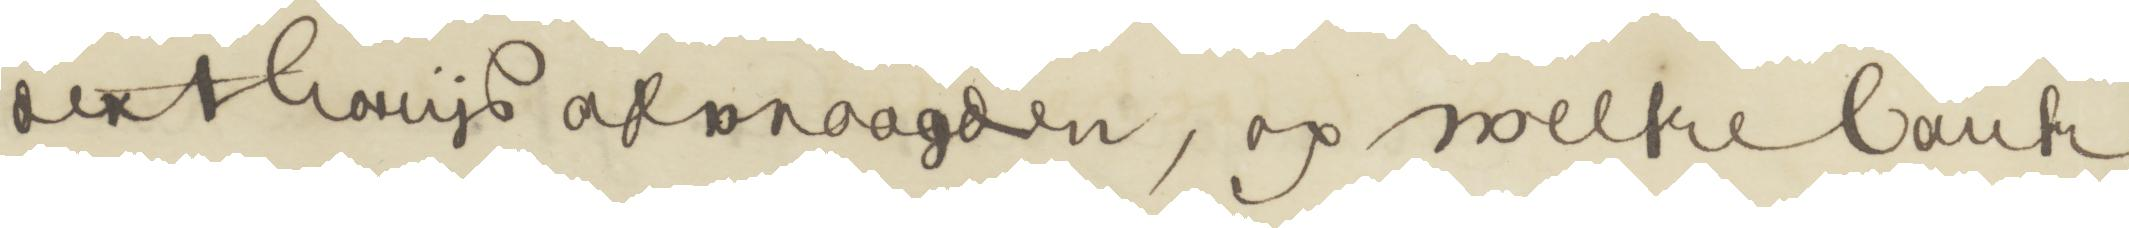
der thonijs afvraagden, op welke bank
